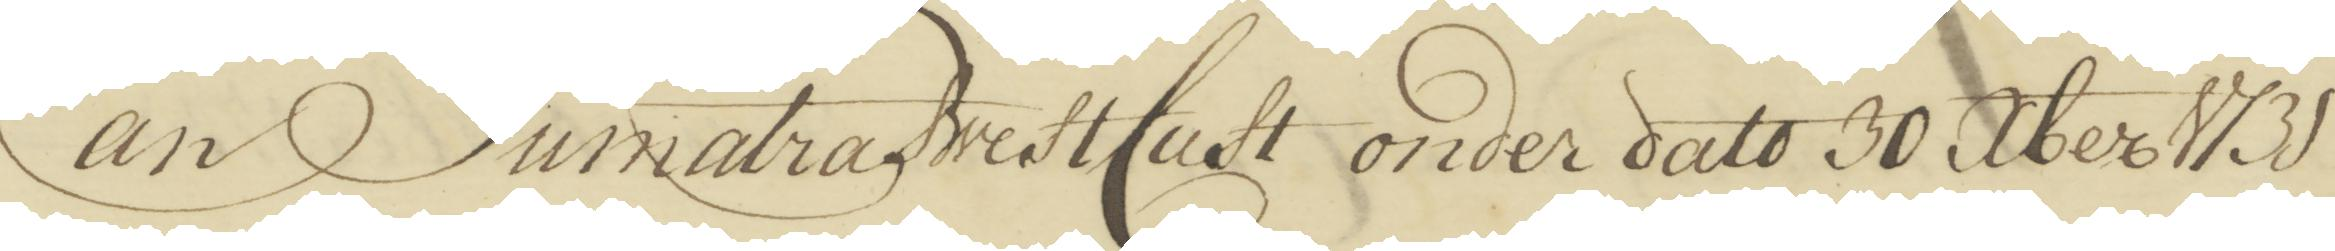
Van Sumatras WestCust onder dato 30 Xber 1731
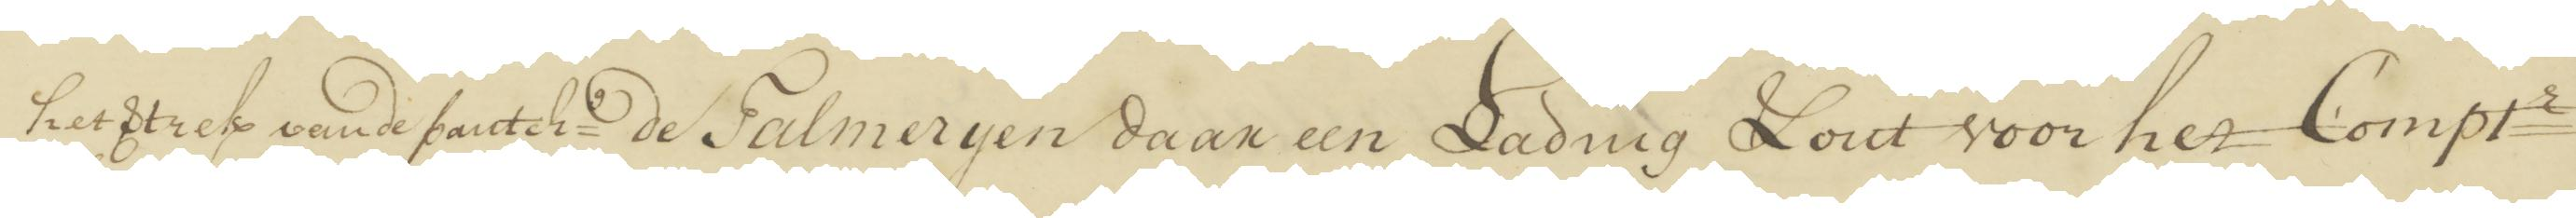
het vertrek van de pantch= de Talmeryen daar een Lading zout voor het Compt=r
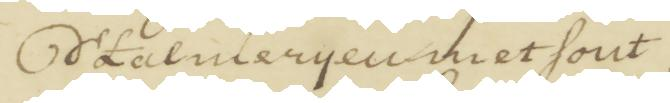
d’Talmerijen met fout
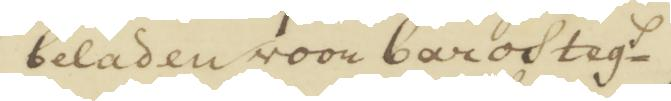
beladen voor baros tegs
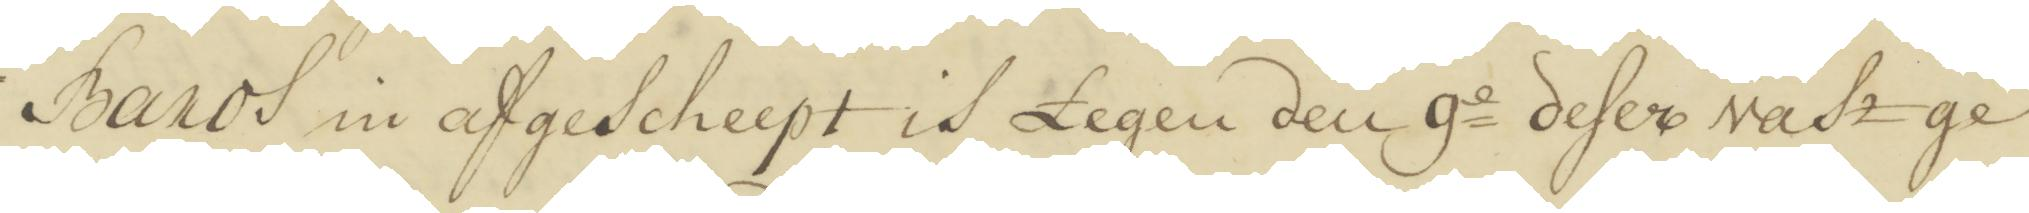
Baros in afgescheept is tegen den 9=e deser vast ge
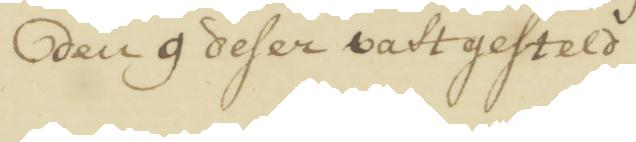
den 9 deser vastgesteld
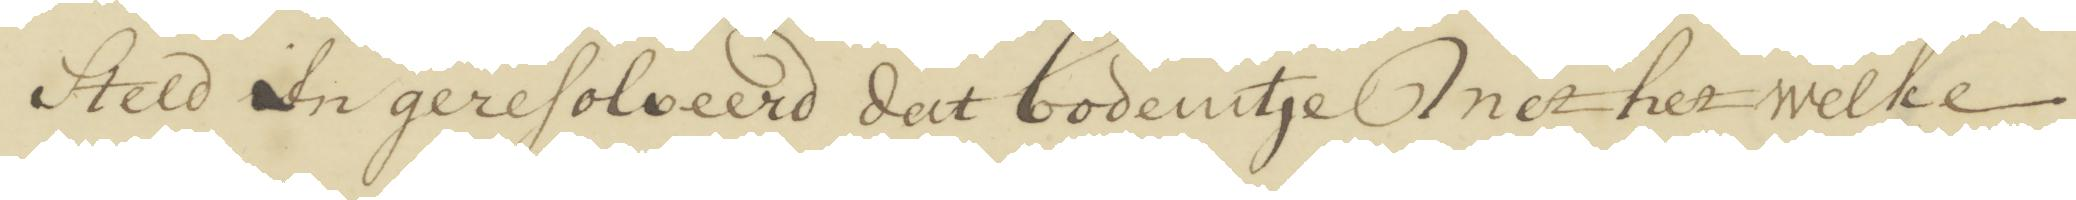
steld en geresolveerd dat bodemtje met het welke
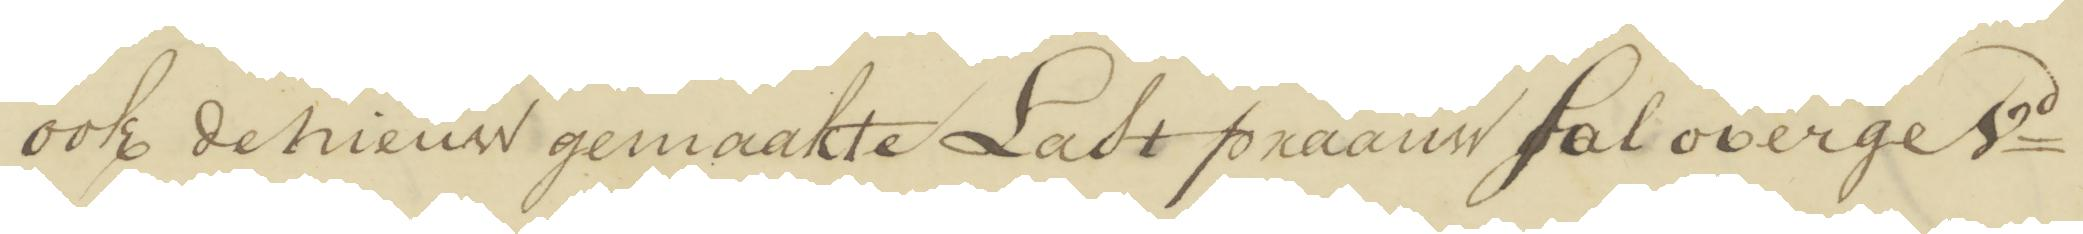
ook de nieuw gemaakte Last praauw sal overgev=d
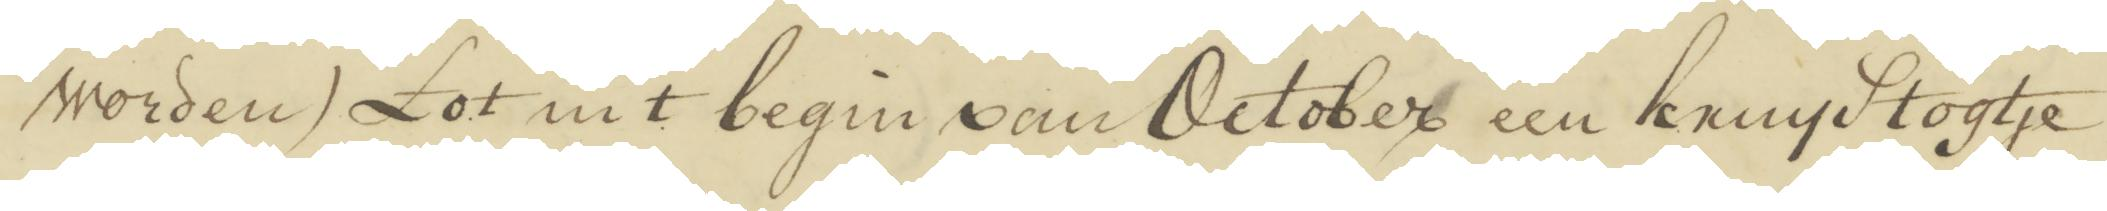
worden) tot in ’t begin van October een kruijstogtje
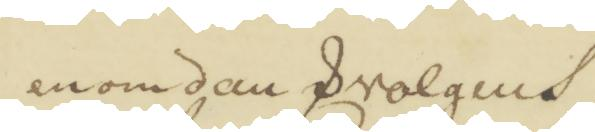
en om dan vervolgens
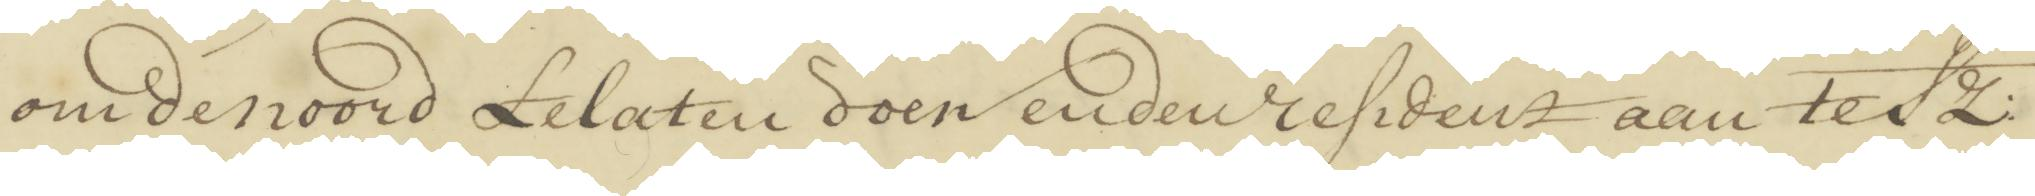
om de noord te laten doen en den resident aan te sz:
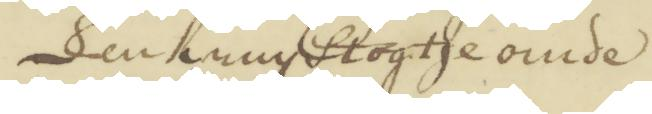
een kruistogtje om de
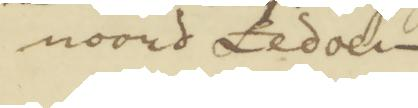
noord te doen
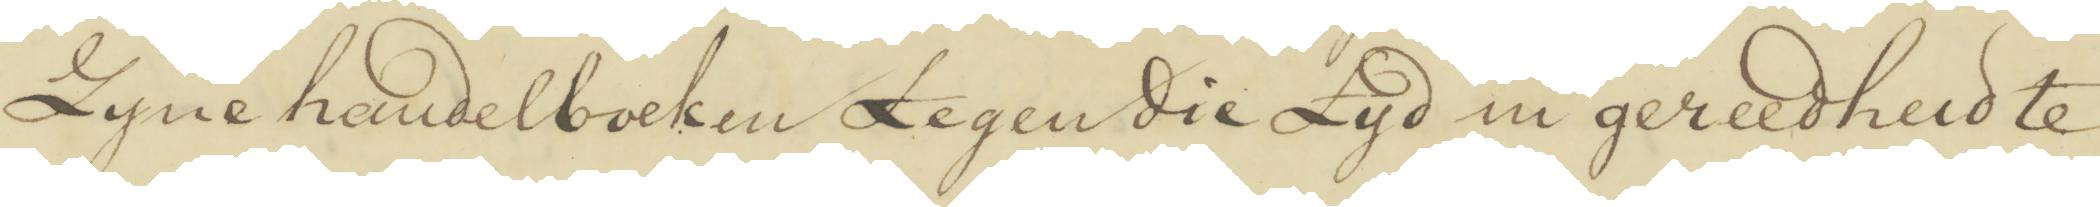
zyne handelboeken zegen die tijd in gereedheid te
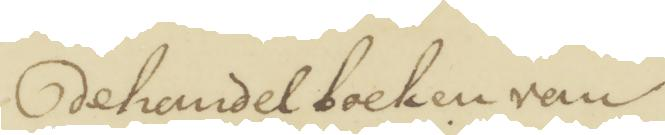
de handel boeken van
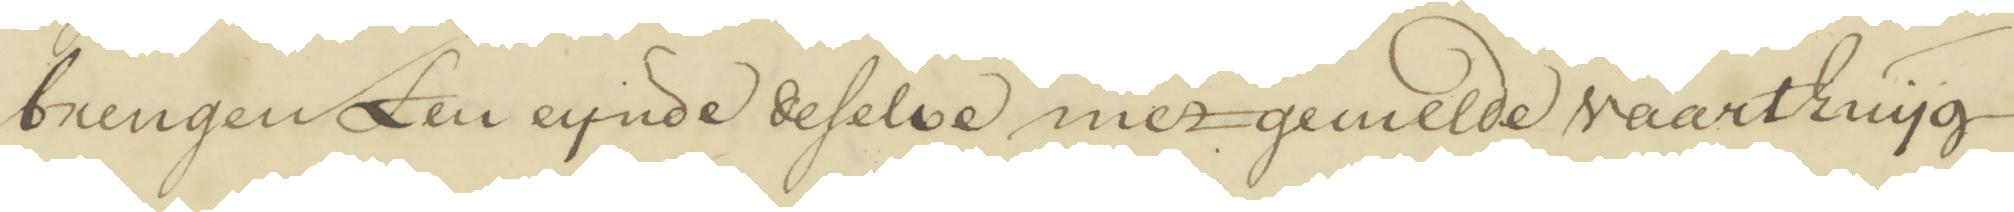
brengen ten eijnde deselve met gemelde vaarthuijg
